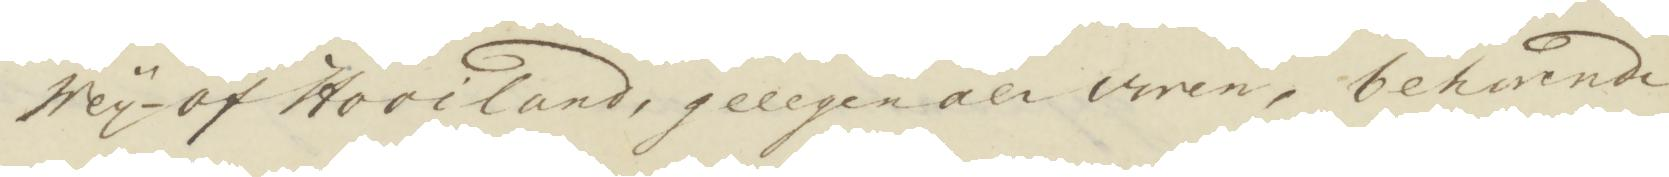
weij of Hooiland, gelegen als voren, beherende
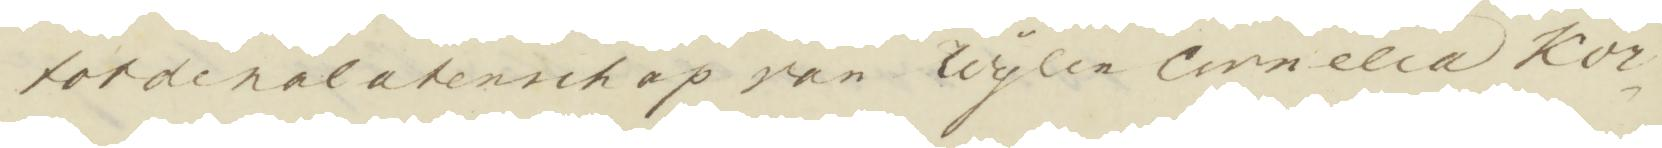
tot de nalatenschap van Wijlen Cornelia Kor
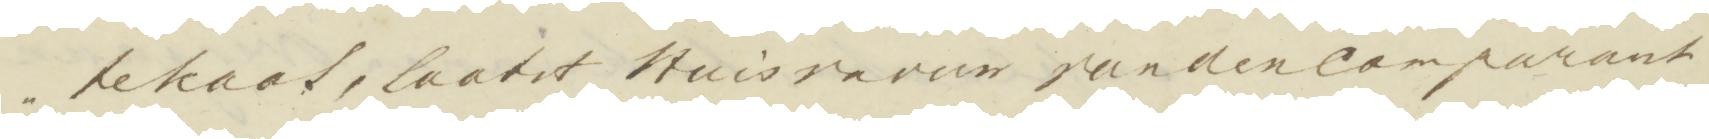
„tekaas, laatst Huisvrouw van den Comparant
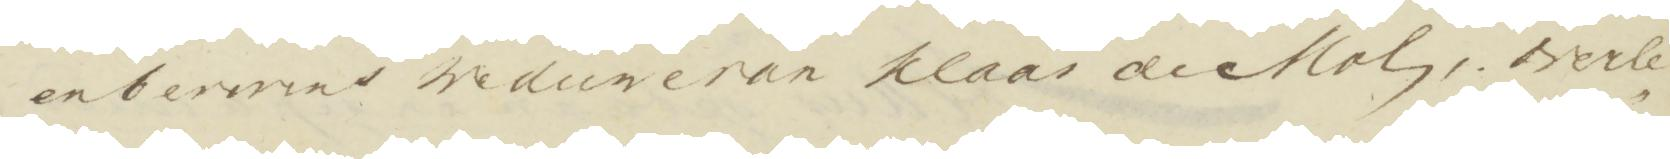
en bevorens weduwe van klaas de Mol,, overle„
